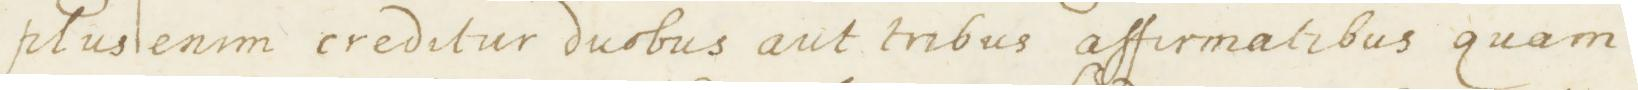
plus enim creditur duobus ant tribus affirmatibus quam
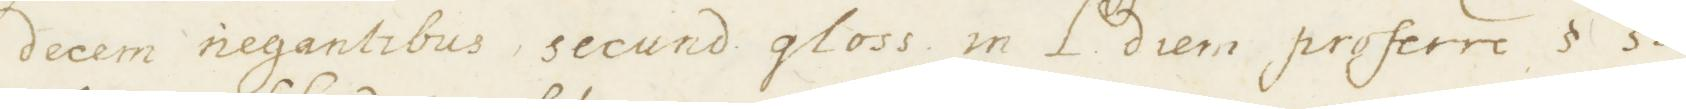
decem negantibus, secund. gloss. in L. diem proferre, 5 51
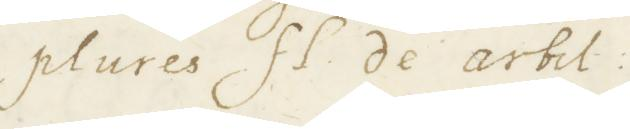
plures FL. de arbit.
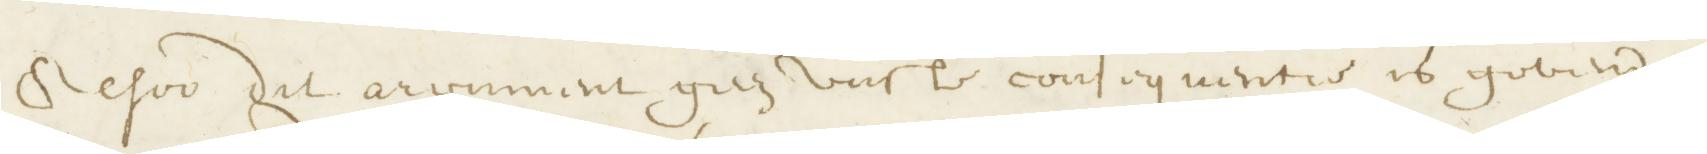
Alsoo dit argument geen vaste consequentie is gevende
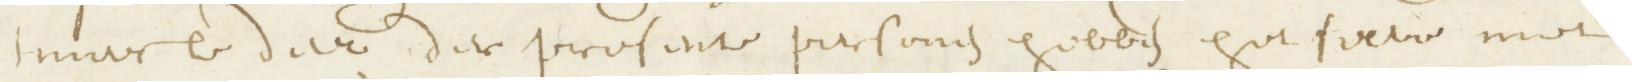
tmeeste der der presente personen hebben hetselve niet
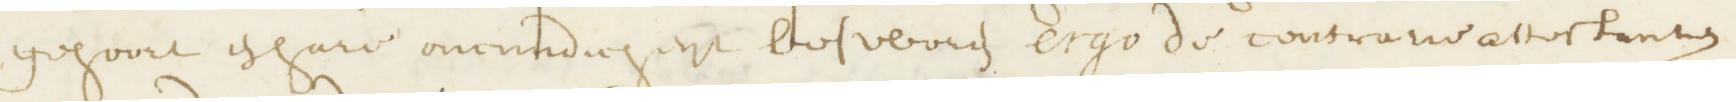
gehoort in hare oncundicheyt besworen ergo de contrarie attestanten
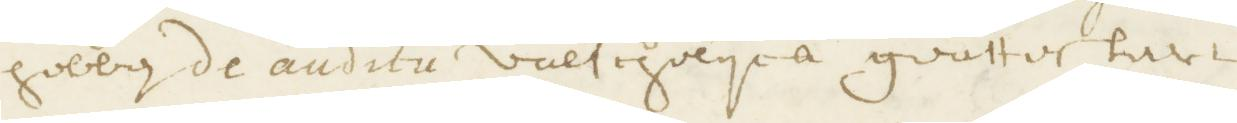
hebben de auditu valschelyck geattesteert
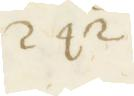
242
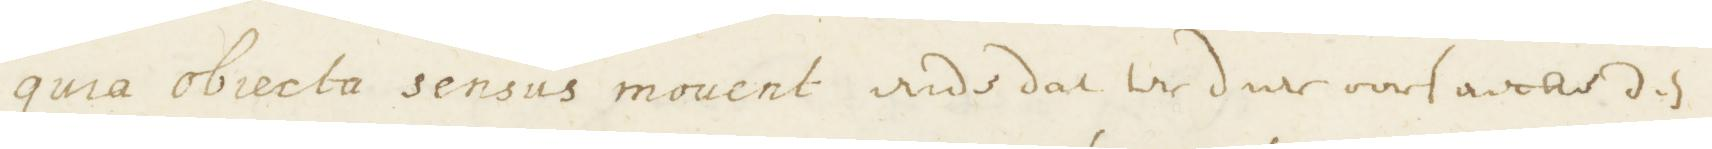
quia obiecta sensus movent ende dat ter dier oorsaecke den
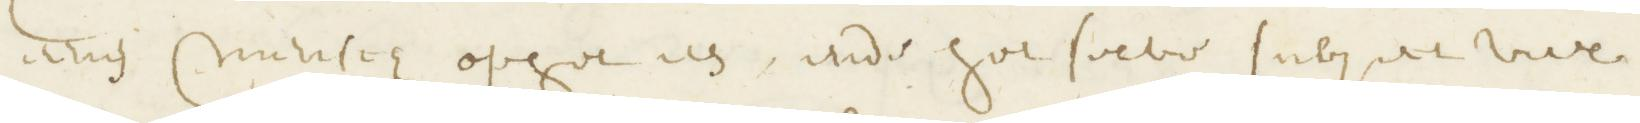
eenen mensch op het een, ende het selve subject wel
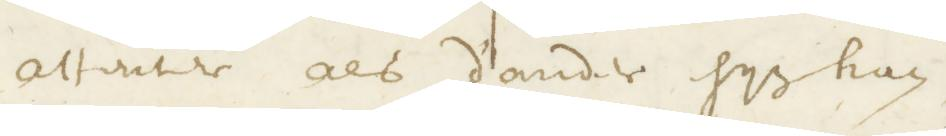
attenter als d'ander syn kan
